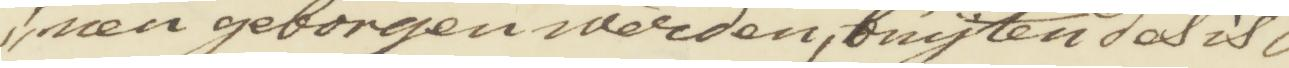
„nen geborgen werden, buijten des is
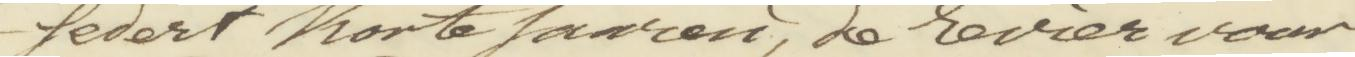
sedert Korte jaaren, de revier voor
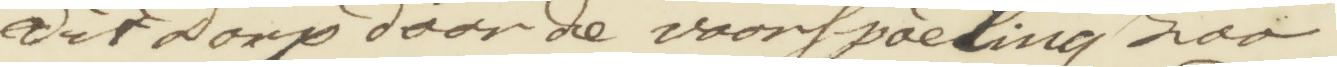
Dit Dorp door de voorspoeling Zoo
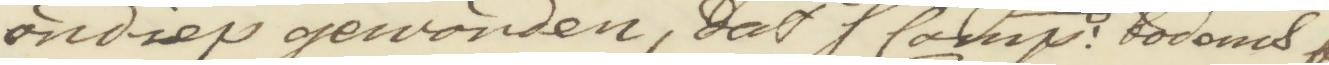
ondiep gewonden, dat ’s Comp:s bodems
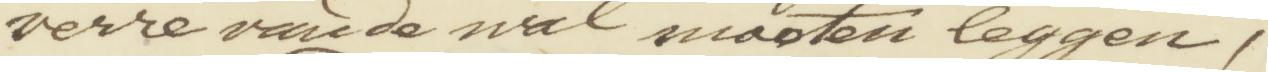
verre van de wal moeten leggen ,
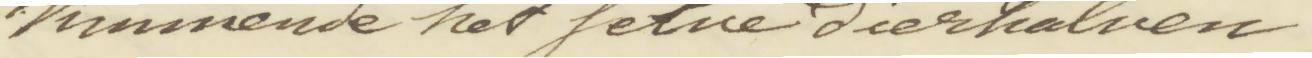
kunnende het selve dierhalven
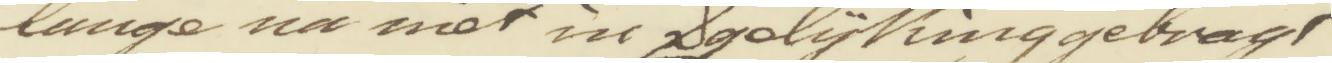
lange na niet in vergelijking gebragt
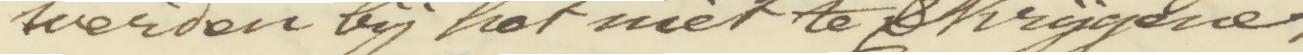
werden bij het niet te verkrijgene
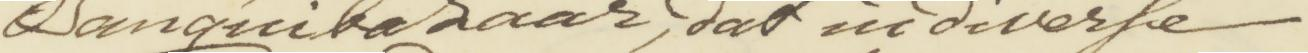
Banquibazaar, dat in diverse
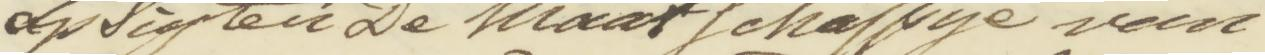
op sigten De Maatschappije van
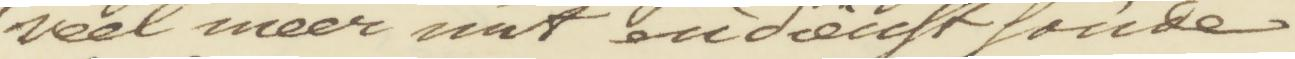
veel meer nut en dienst soude
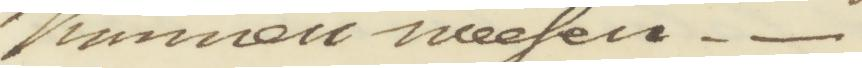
Kunnen weesen.—
